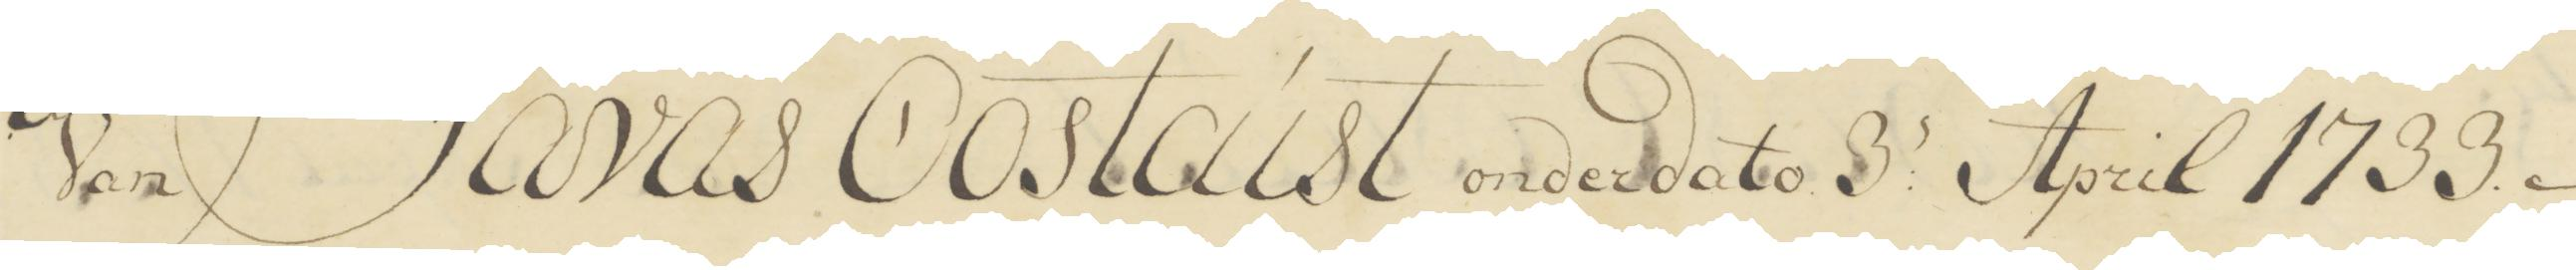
Van Javas Oostcust onder dato 3:' April 1733. —
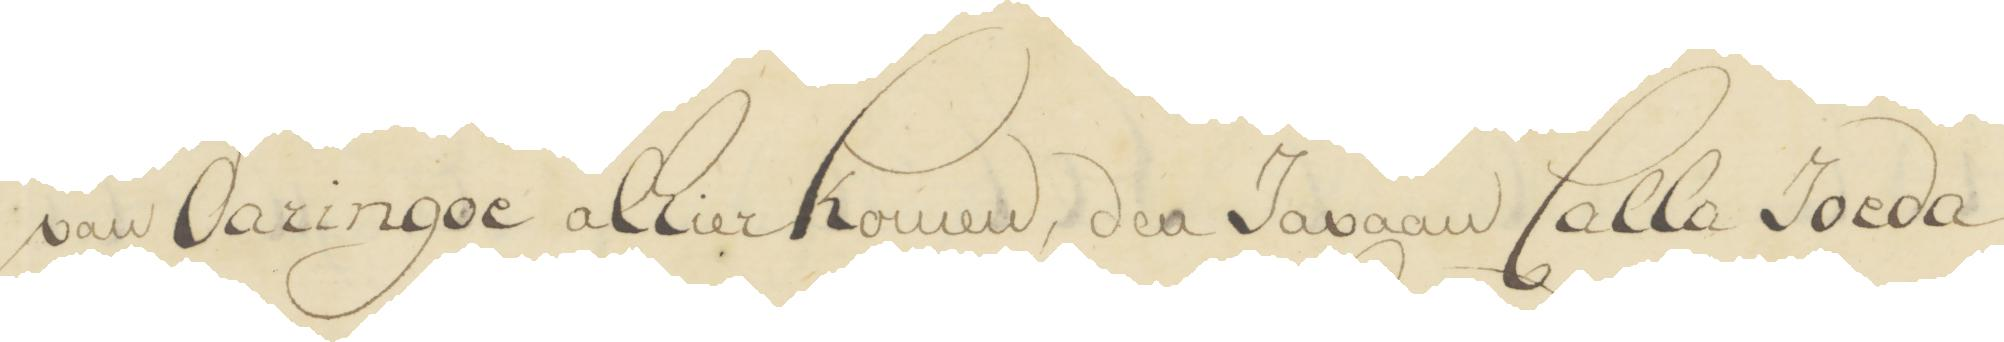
van daringoe alhier komen, den Javaan Calla Ioeda
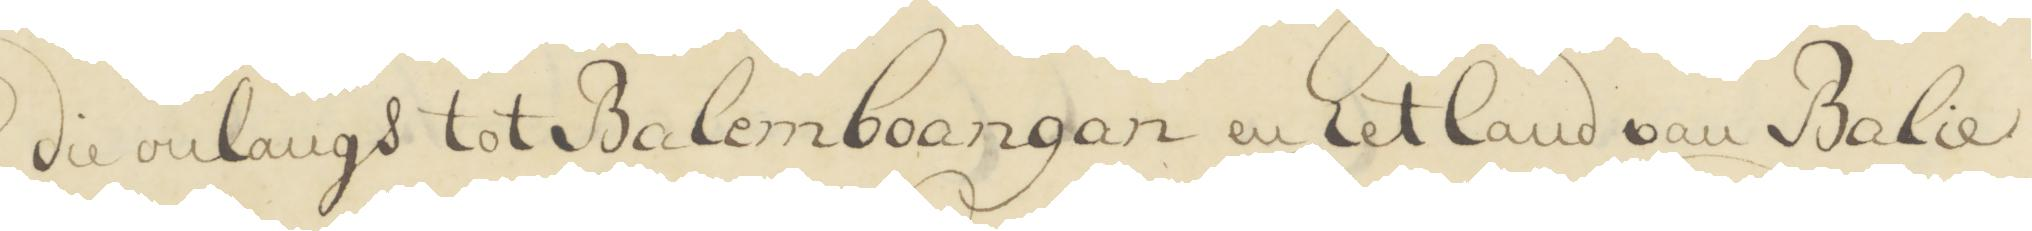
die onlangs tot Balemboangan en het land van Balie
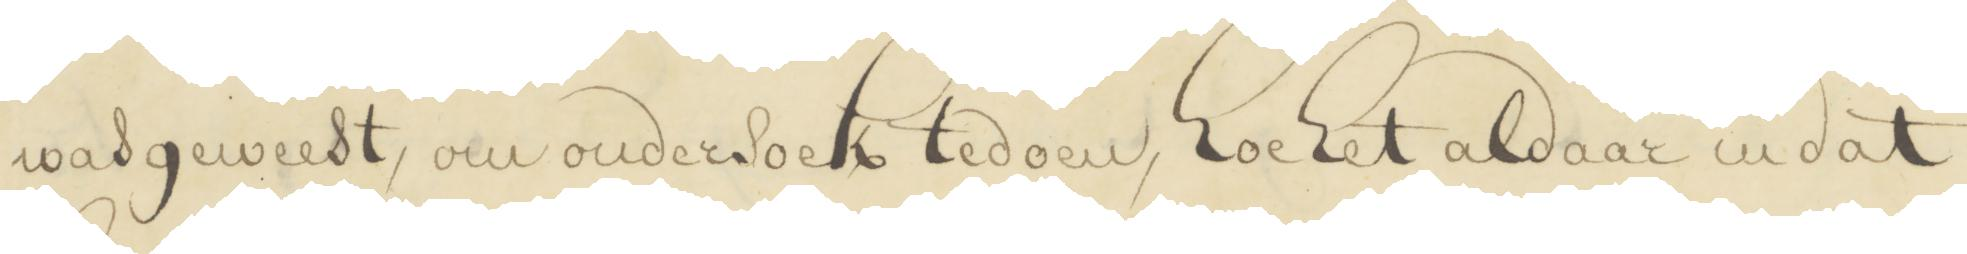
was geweest, om ondersoek te doen, hoe het aldaar in dat
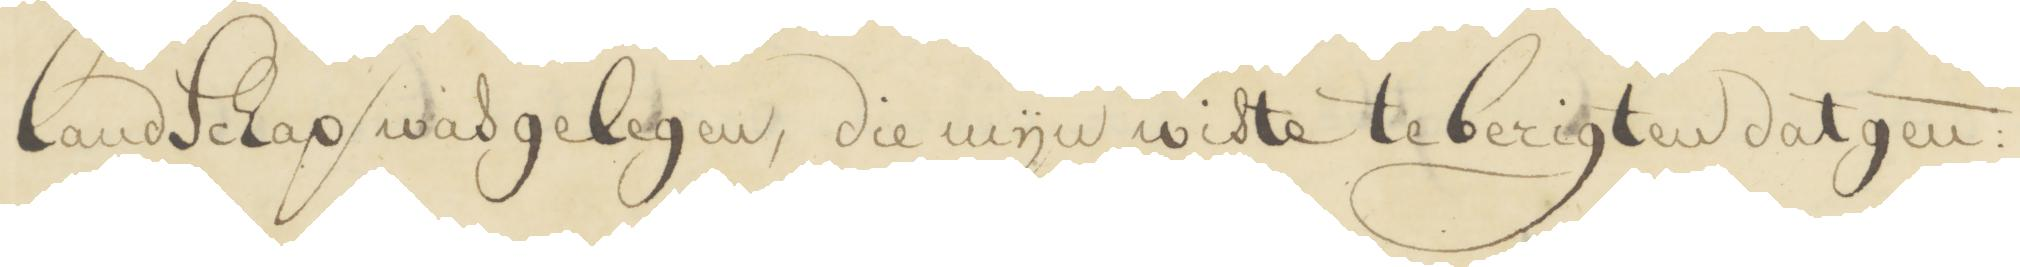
landschap was gelegen, die mijn wiste te berigten dat gen:
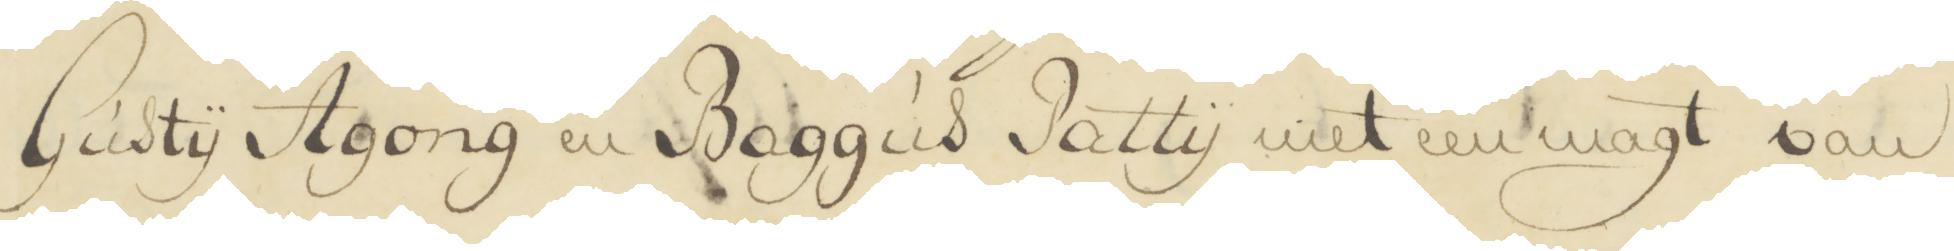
Gustij Agong en Baggus Pattij met een magt van
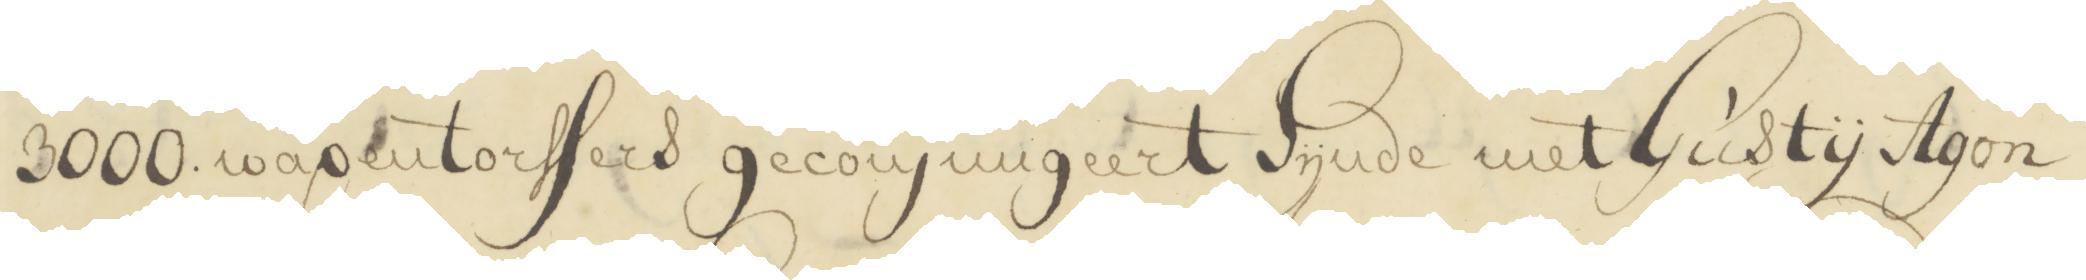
3000. wapentorssers geconjungeert sijnde met Gustij Agon
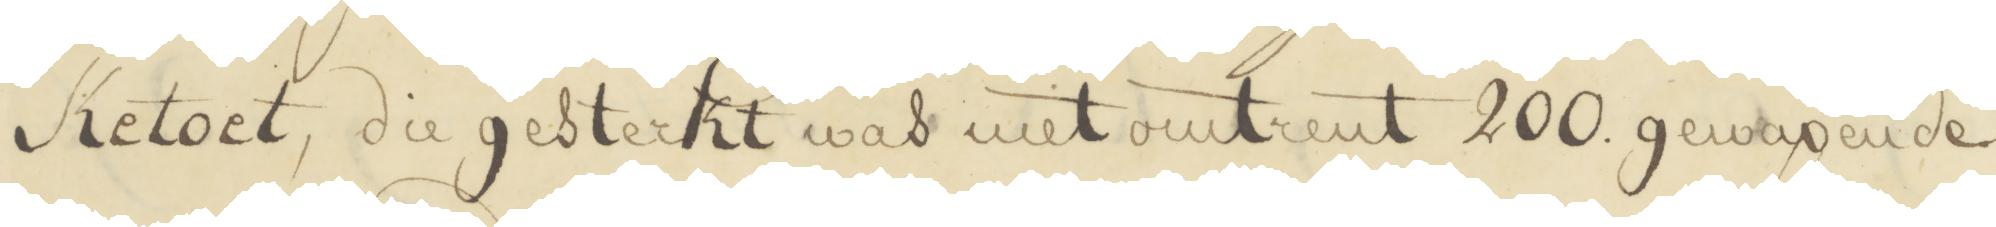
Ketoet, die gesterkt was met omtrent 200. gewapende
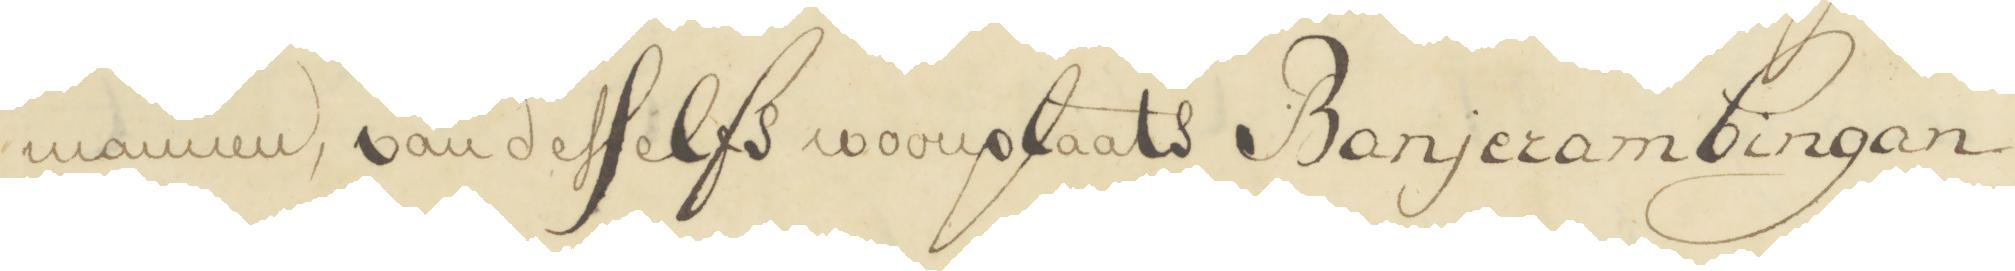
mannen, van desselfs woonplaats Banjerambingan
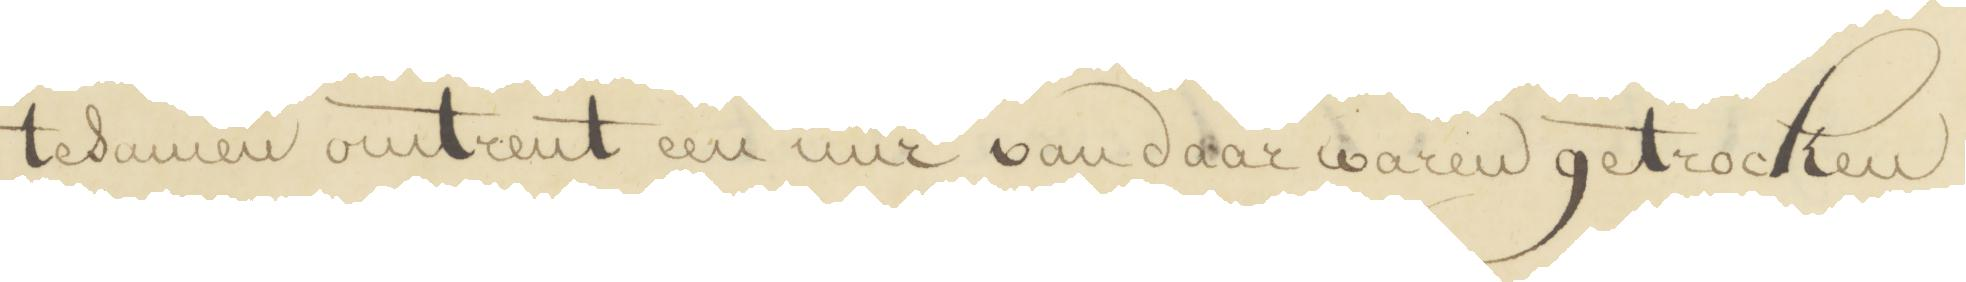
tesamen omtrent een uur van daar waren getrocken
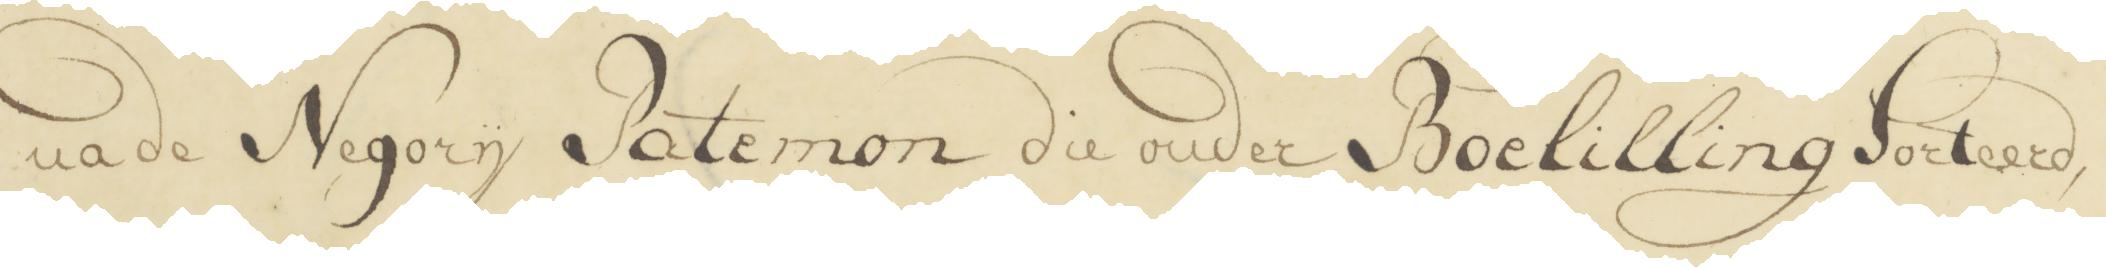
na de Negorij Patemon die onder Boelilling sorteerd,
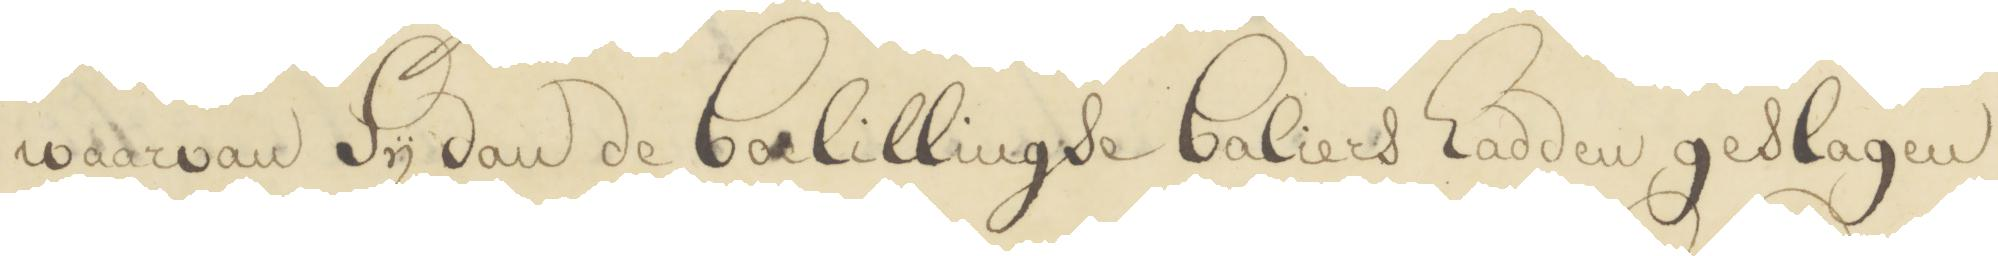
waarvan sij dan de boelillingse baliers hadden geslagen
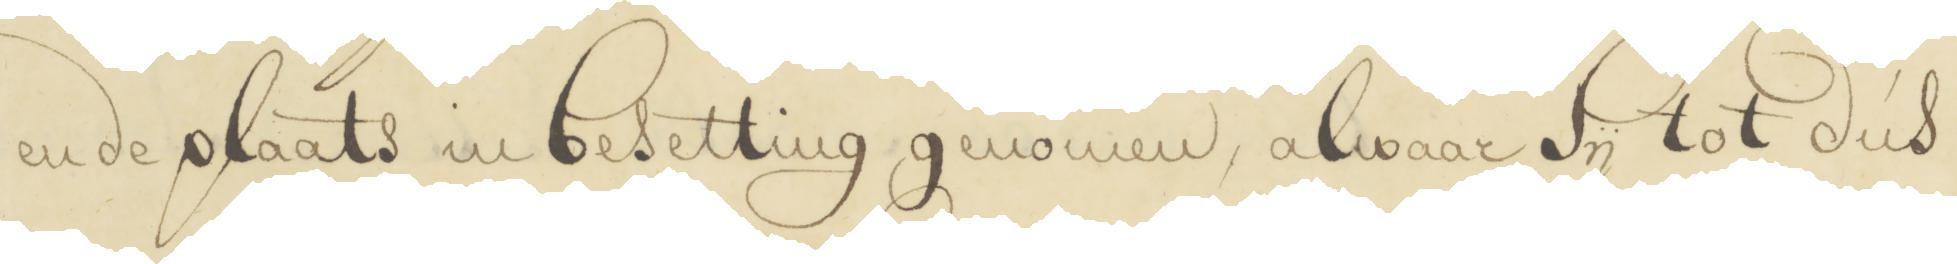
en de plaats in besetting genomen, alwaar sij tot dus
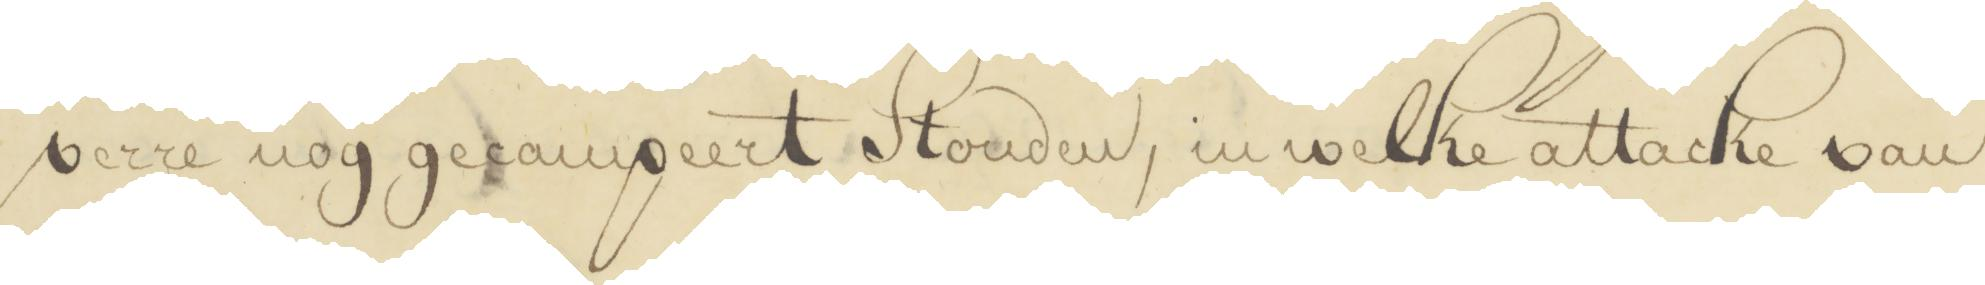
verre nog gecampeert stonden, in welke attacke van
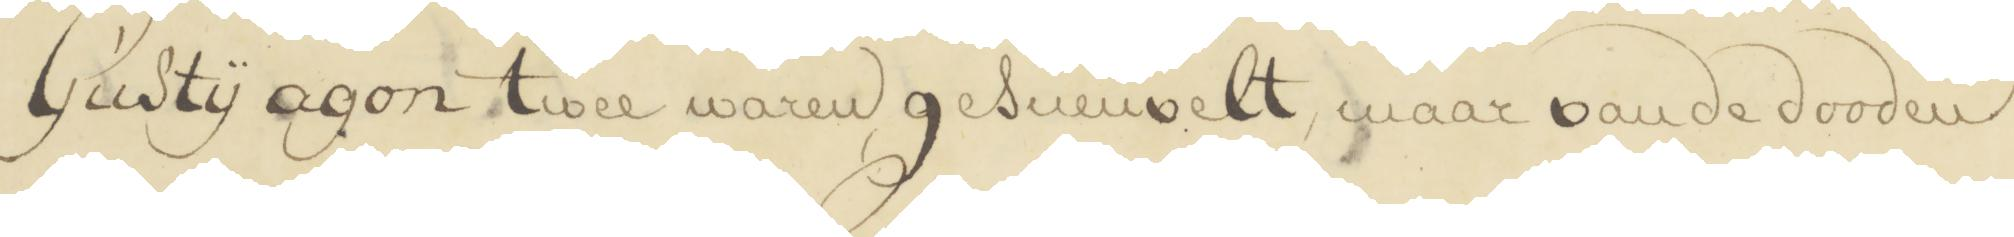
Gustij agon twee waren gesneuvelt, maar van de dooden
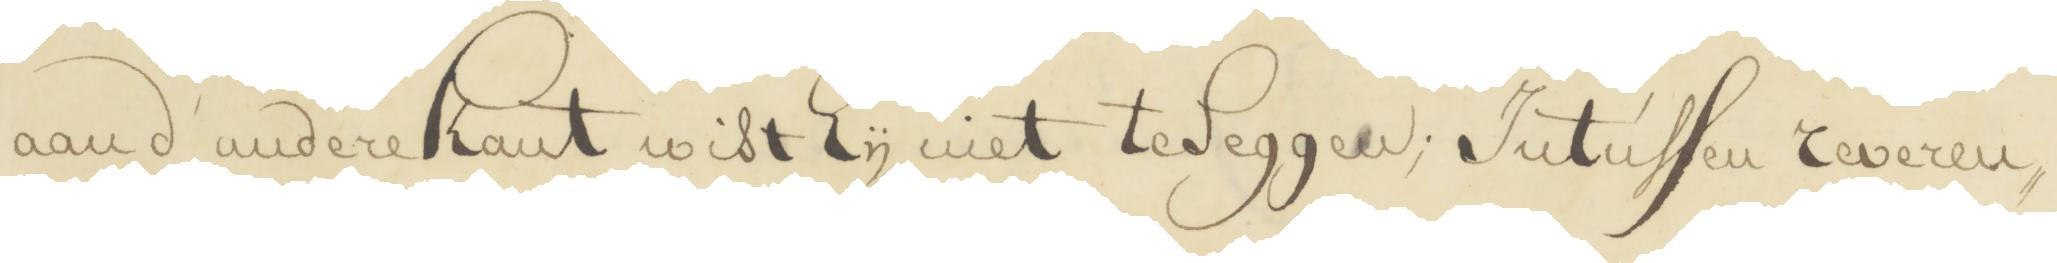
aan d’ andere kant wist hij niet te seggen; Intussen reveren„
